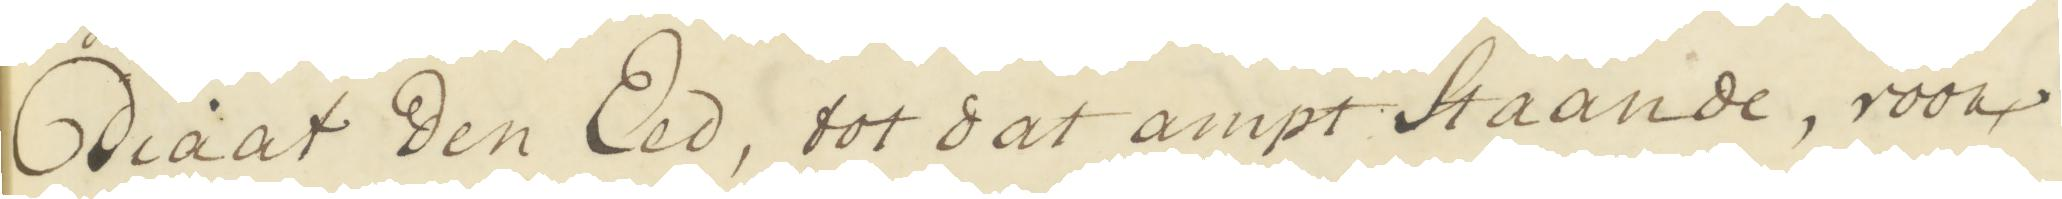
diaat den Eed, tot dat ampt staande, voor
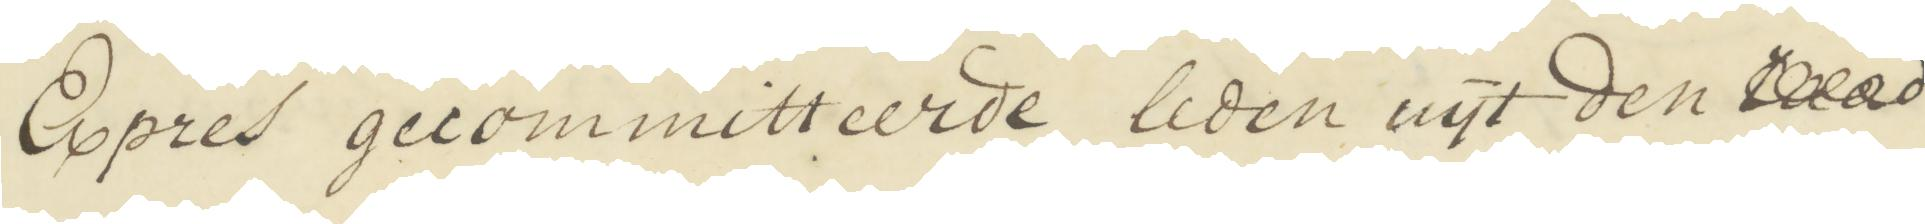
Expres gecommitteerde leden uijt den raad
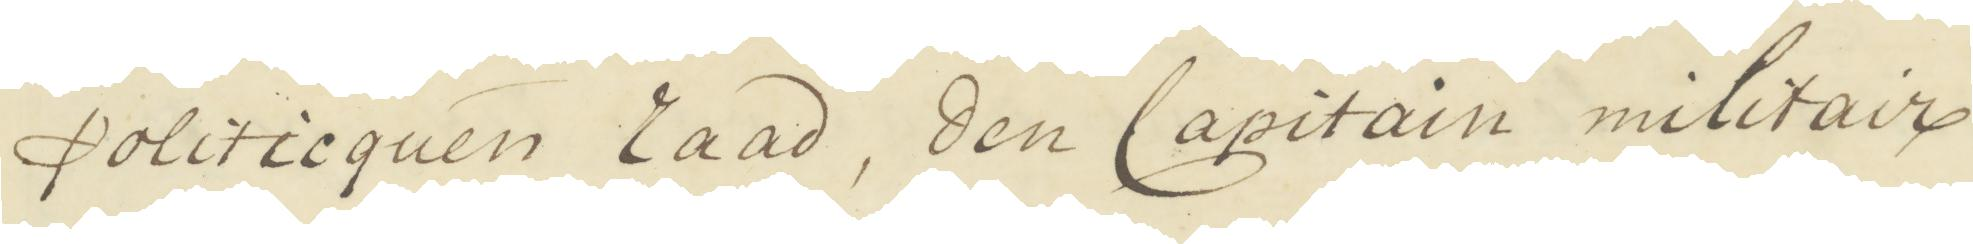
politicquen raad, den Capitain militair
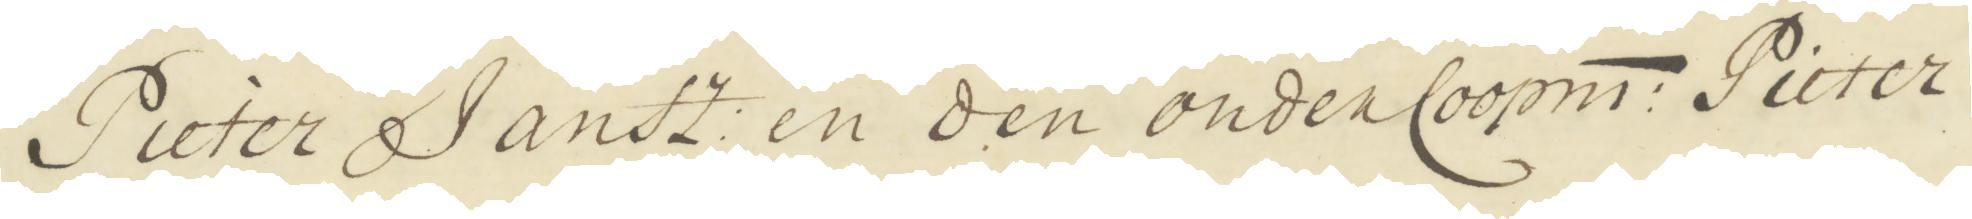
Pieter Jansz: en den onder Coopm: Pieter
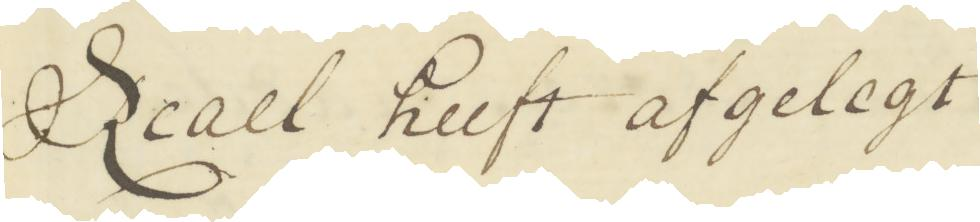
Reael heeft afgelegt
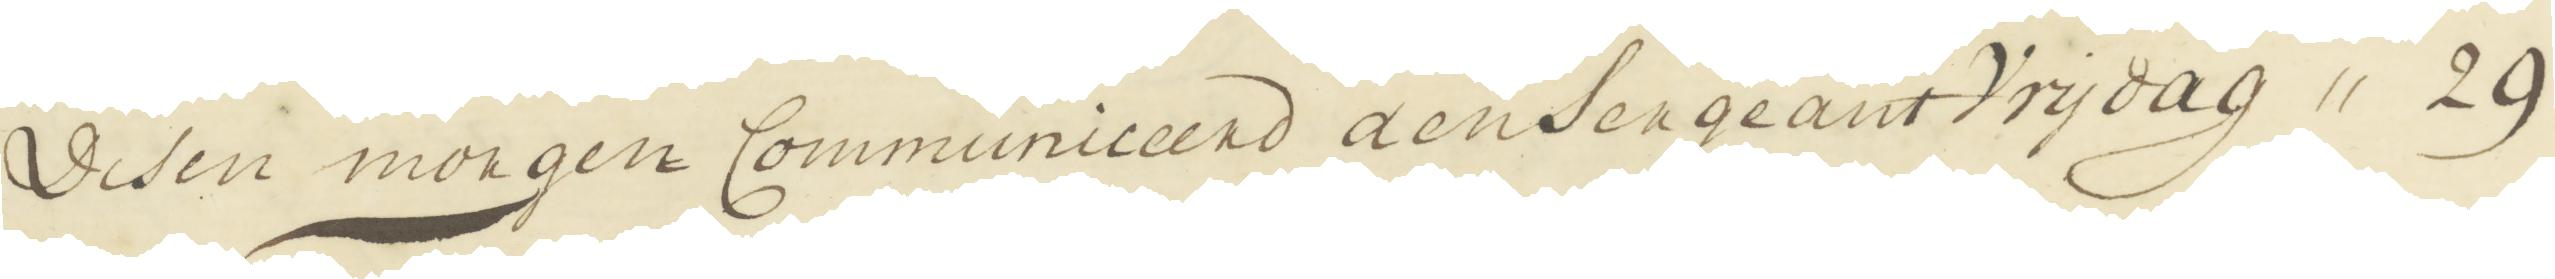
Desen morgen communiceerd den sergeant Vrijdag „ 29
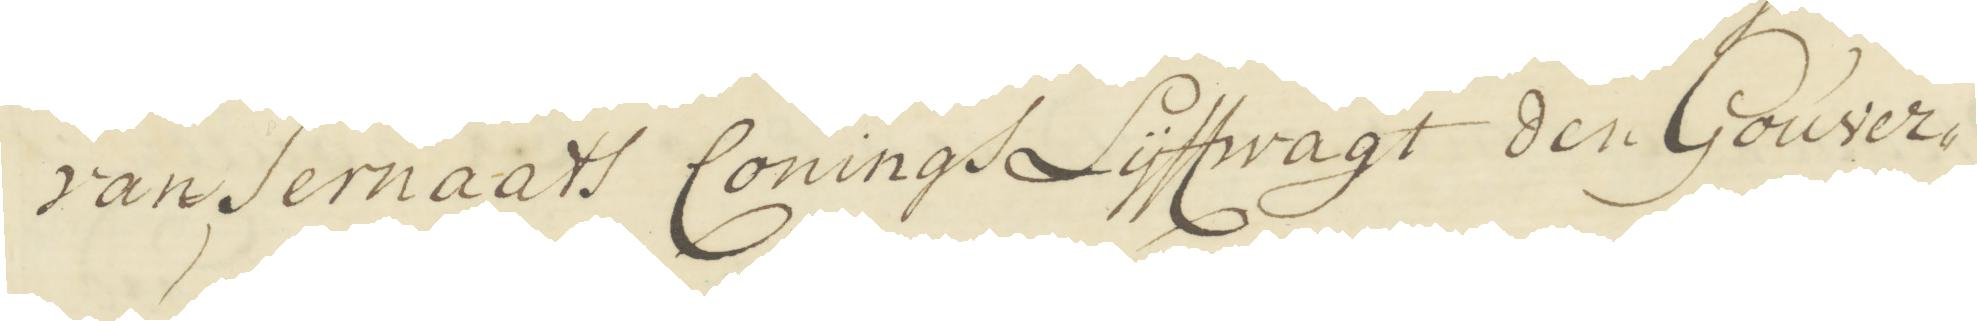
van Ternaats Conings Lijffwagt den Gouver„
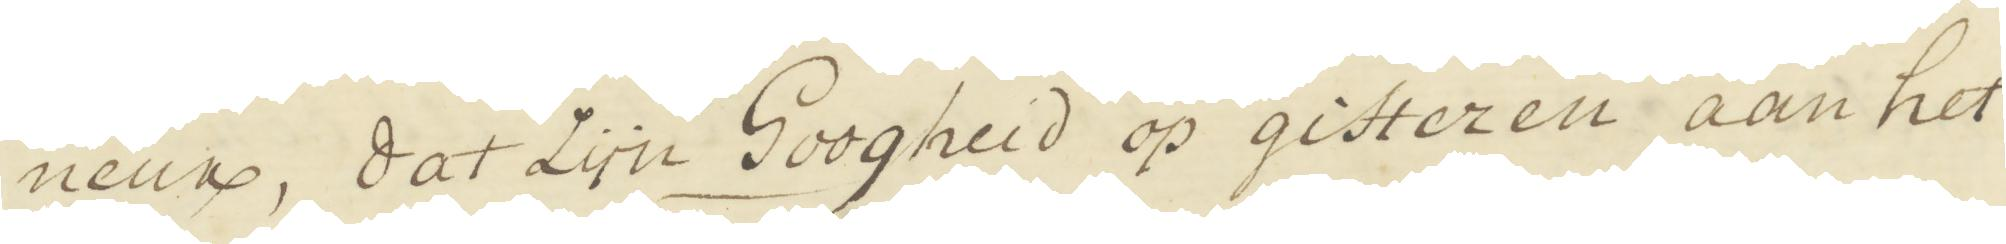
neur, dat zijn hoogheid op gisteren aan het
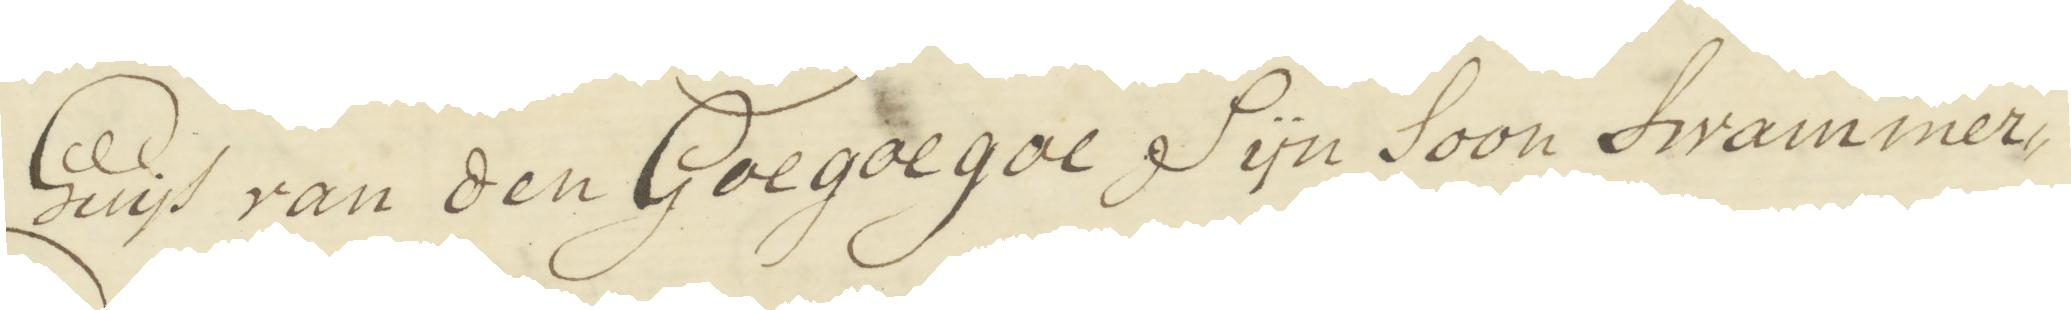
huijs van den Goegoegoe Sijn soon swammer„
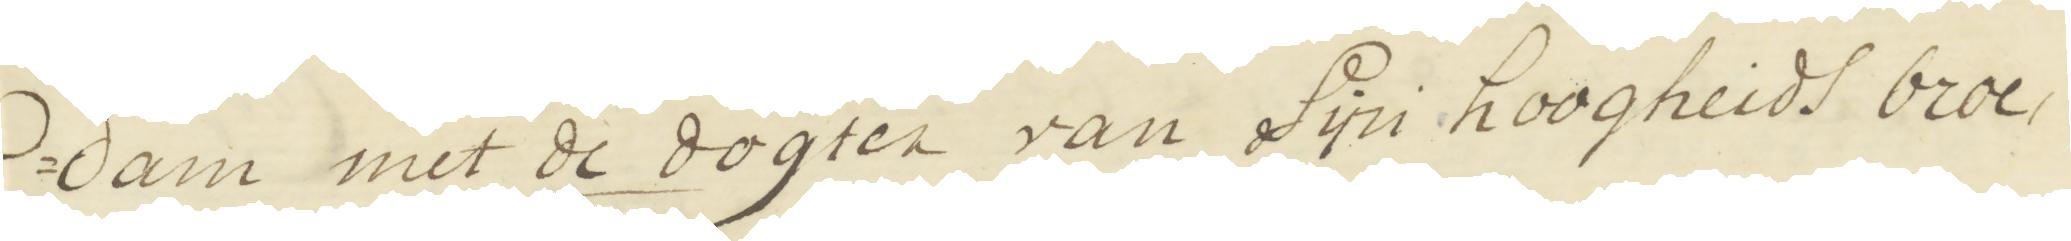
=dam met de dogter van sijn hoogheids broe,
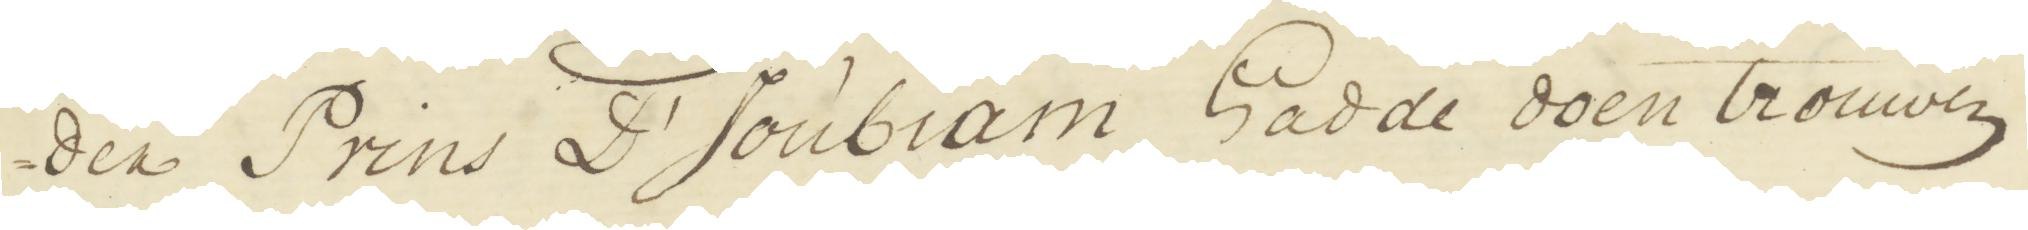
=der Prins D' Joubiam hadde doen trouwen
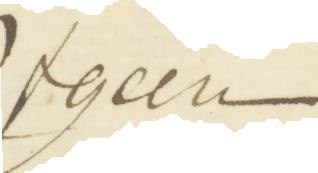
'tgeen
